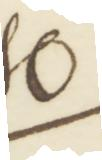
0
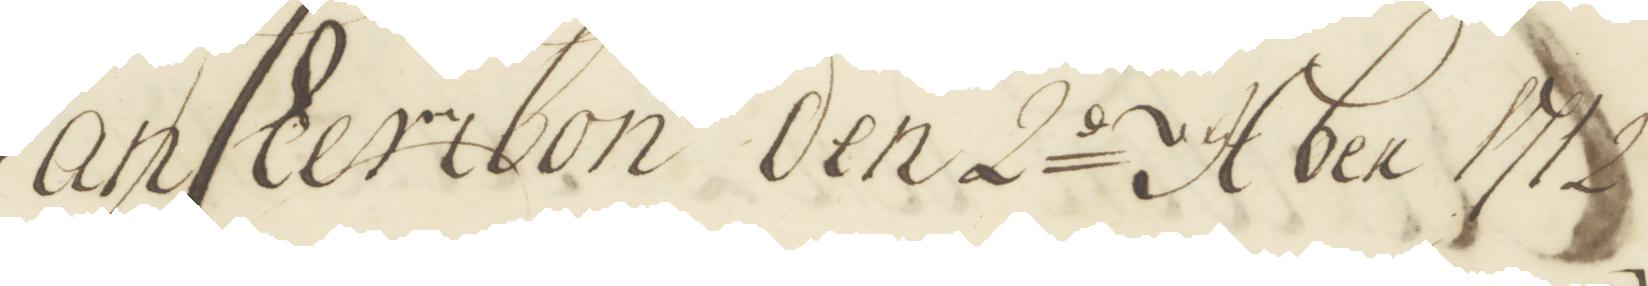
Van Cheribon den 2=e Xber 1712
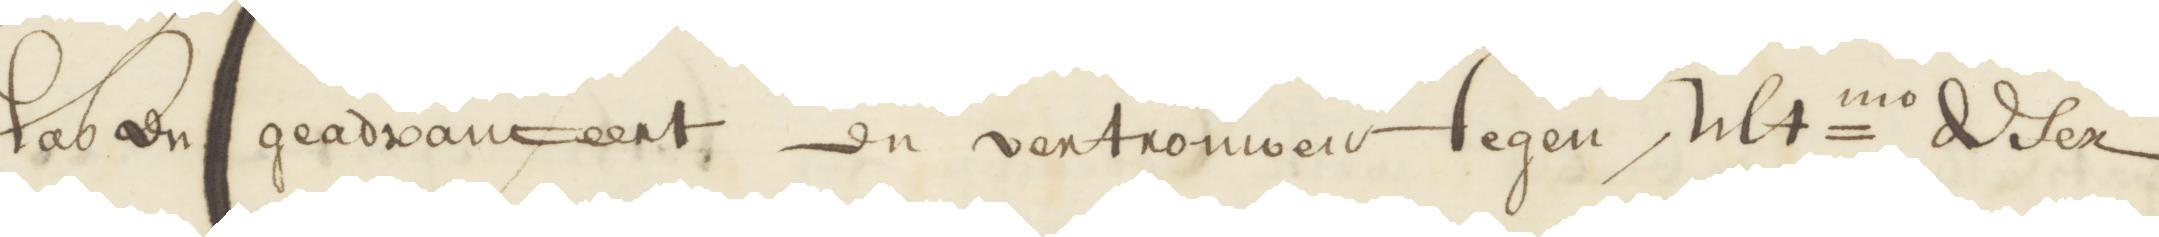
lasten geadvanceert en vertrouwen tegen, ult=mo deser
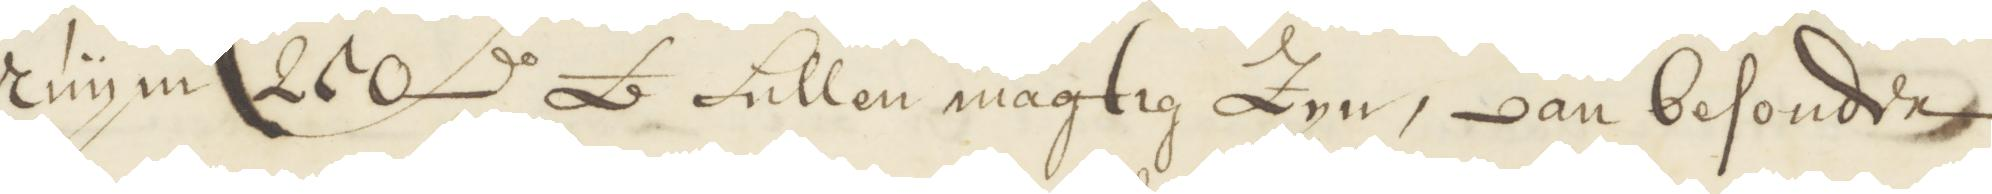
ruijm 250 _o te sullen magtig Zijn, van besonder
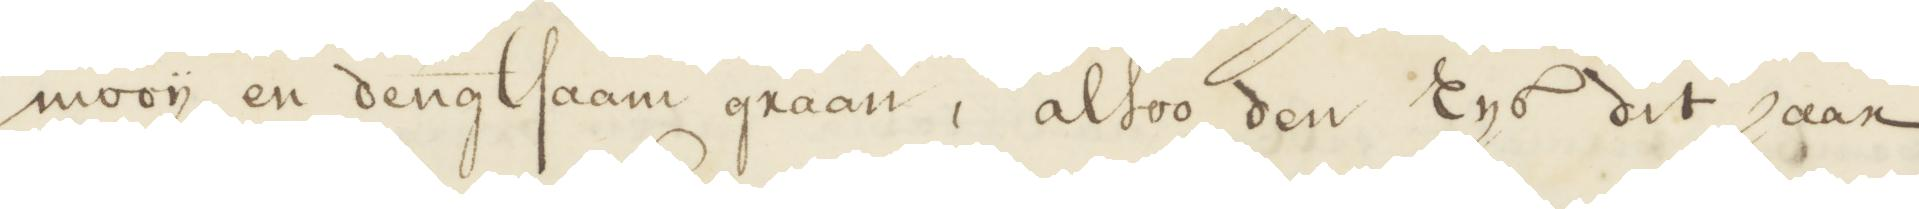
mooij en deugtsaam graan, alsoo den rijs dit haar
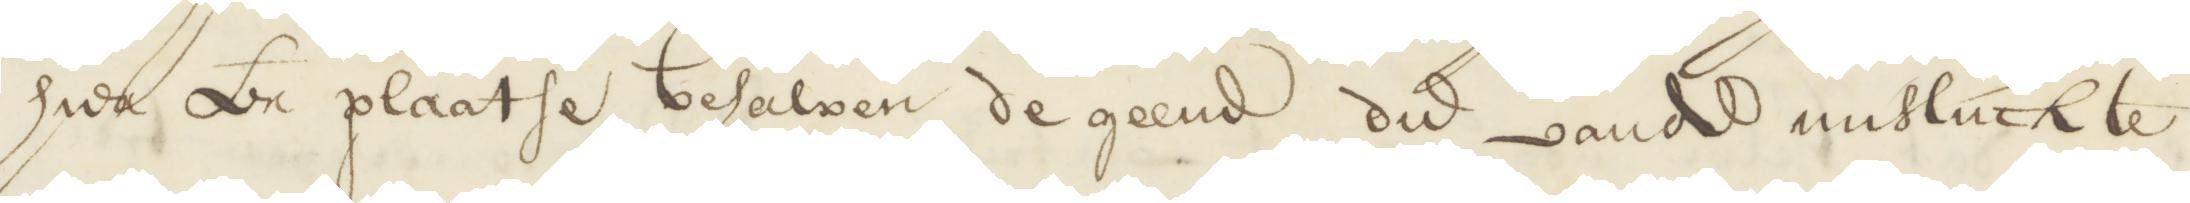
hier te plaatse behalven de geene die vande misluck te
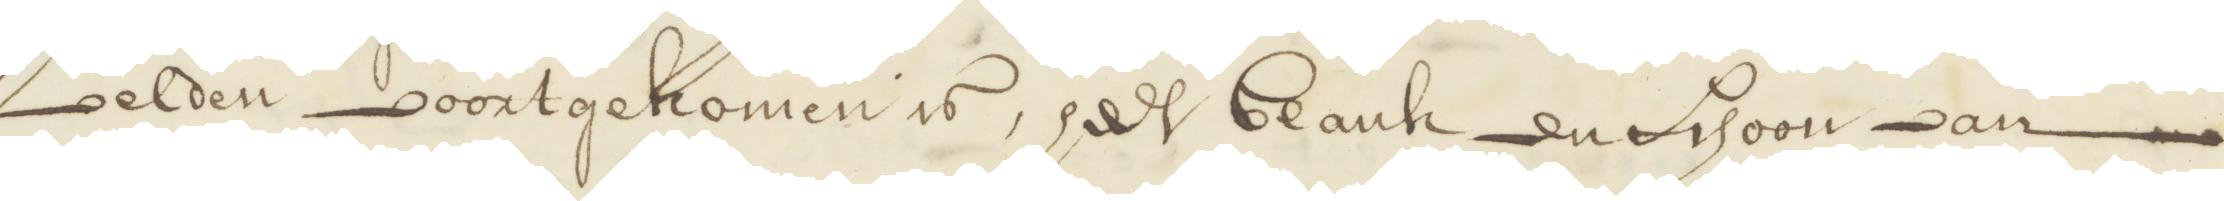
velden voortgekomen is, heel blank en schoon van
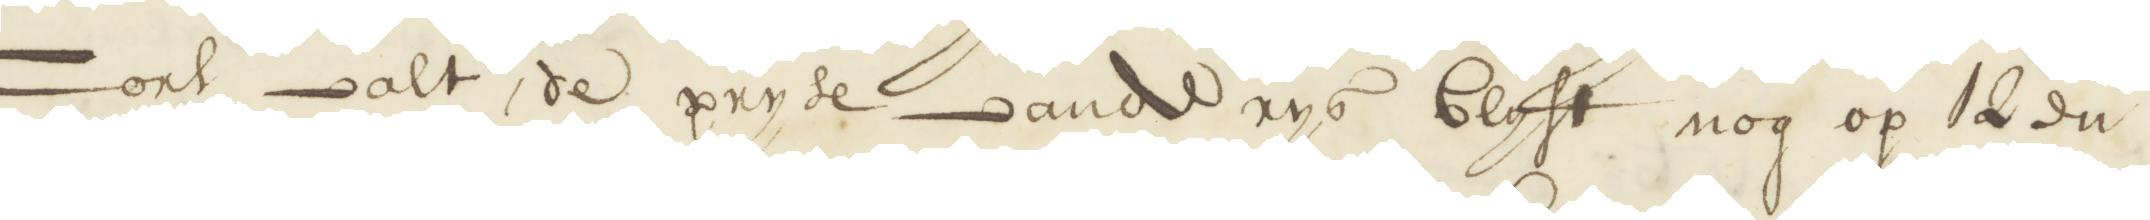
Corl valt, de prijse vande rijs blijft nog op 12 en
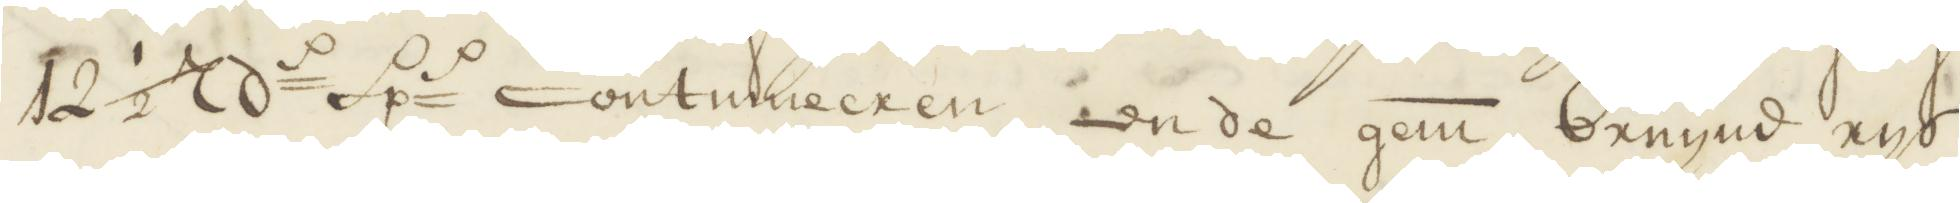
12½ rd=s sp=s continueeren en de gem bruijne rijs
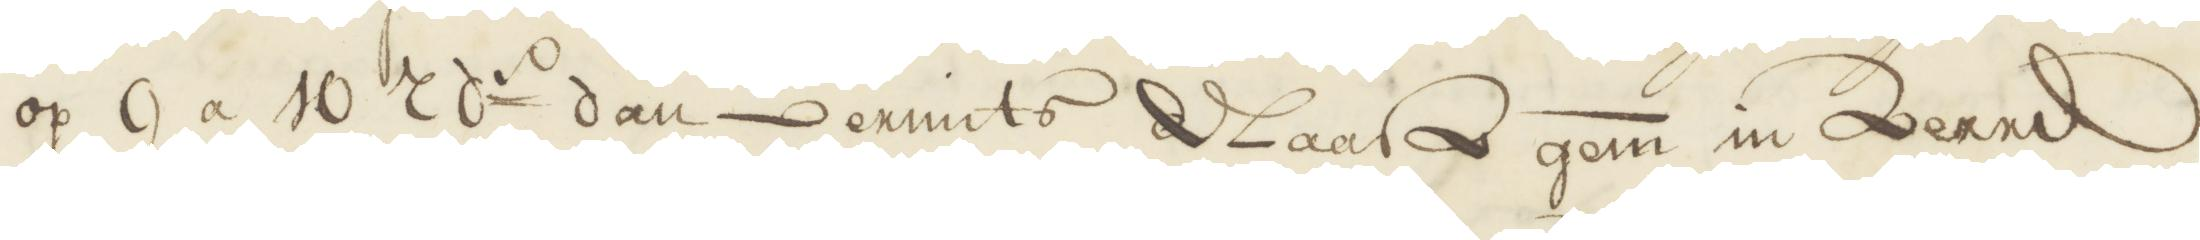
op 9 a 10 rd=s dan vermits de laast gem in verre
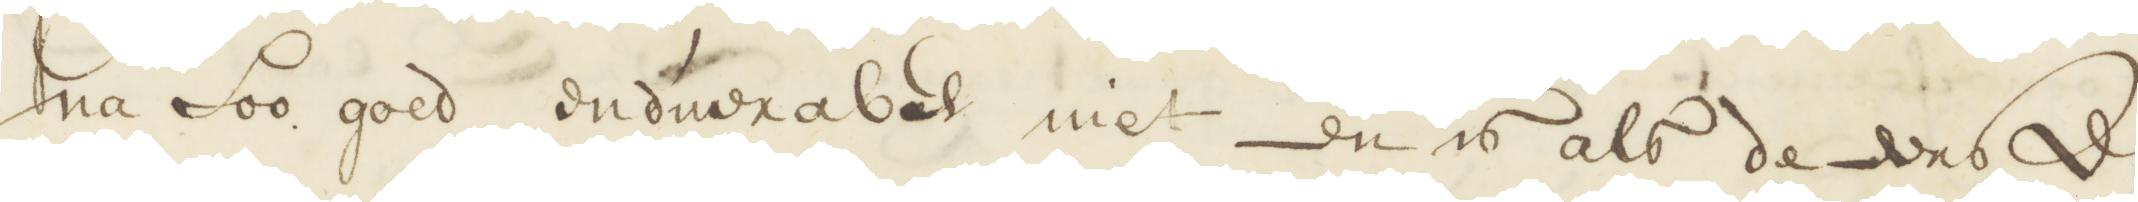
na soo goed enduerabel niet en is als de eerste
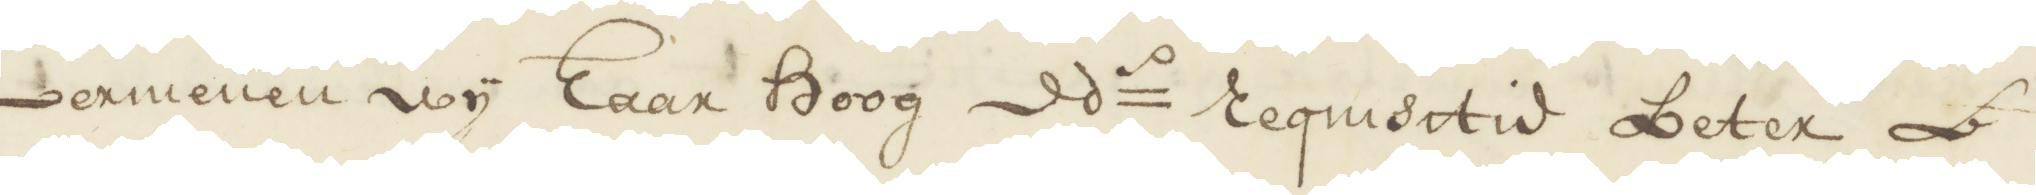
vermenen wij haar Hoog Ed=e requisitie beter te
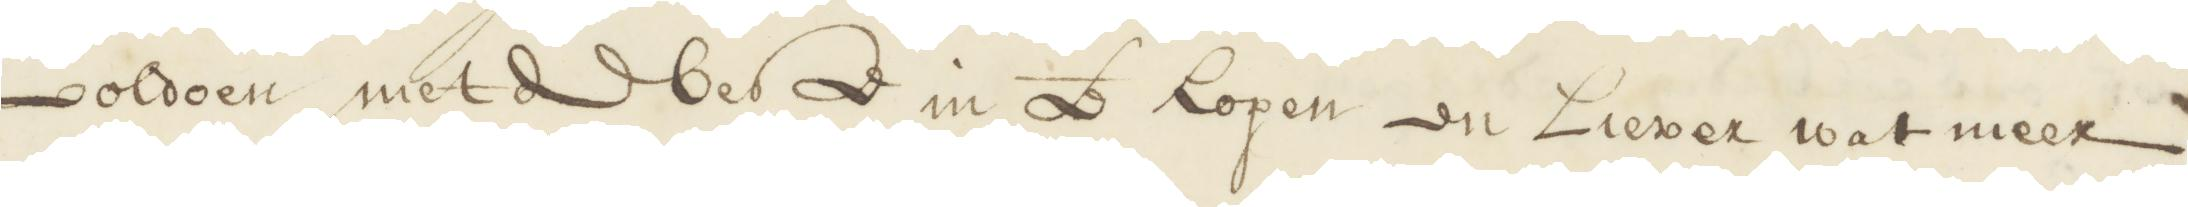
voldoen met de beste in te kopen en liever wat meer
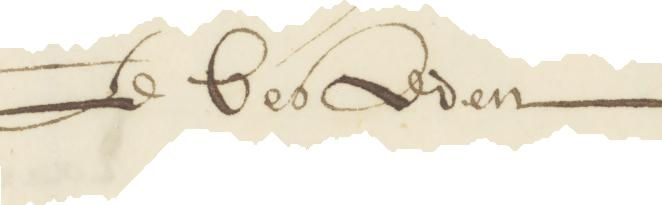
te besteden
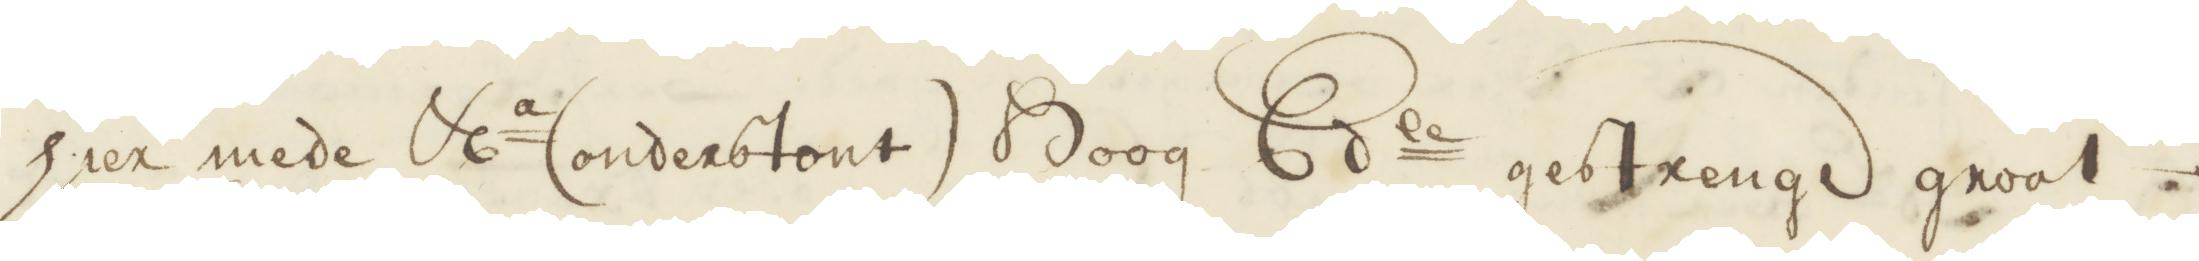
hier mede et=a (onderstont) Hoog Ed=le gestrenge groot
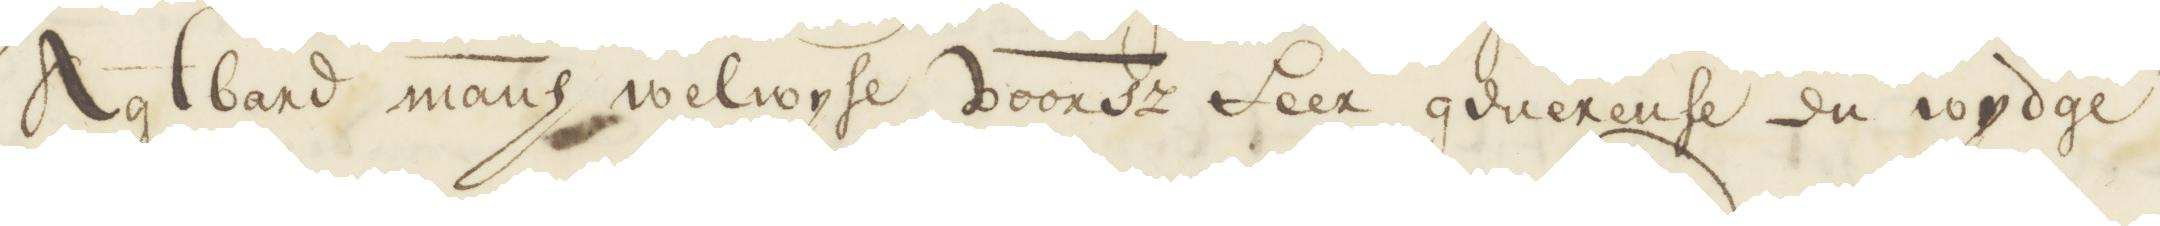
Agtbare manh welwijse voorsz seer genereuse en wijdge
